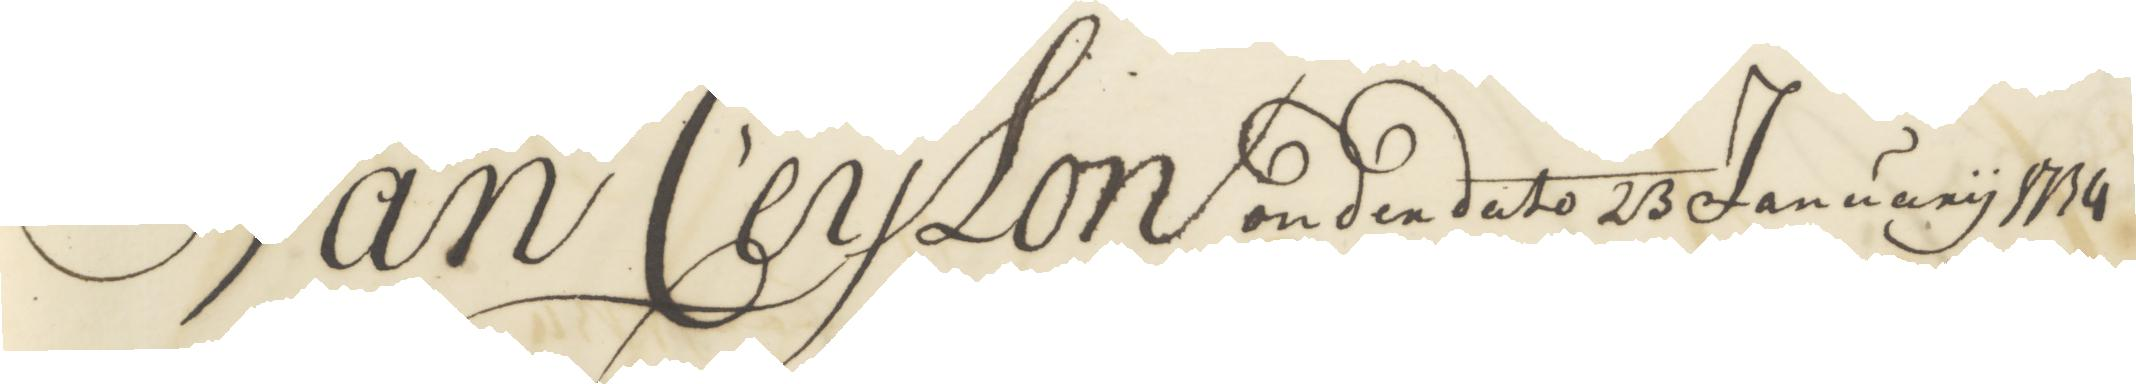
Van Ceylon onder dato 23 Ianuarij 1734
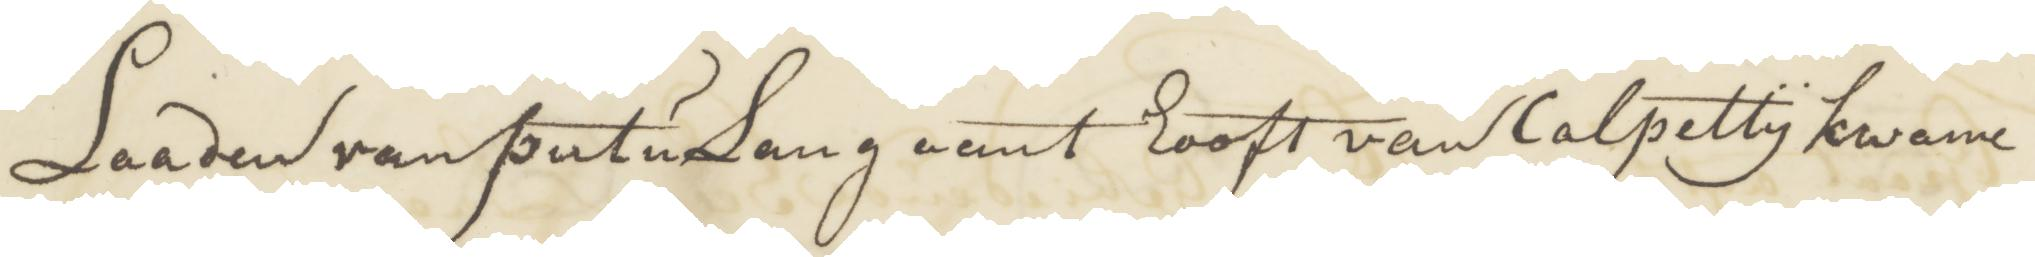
Laaden van putulang aant hooft van Calpettij kwame
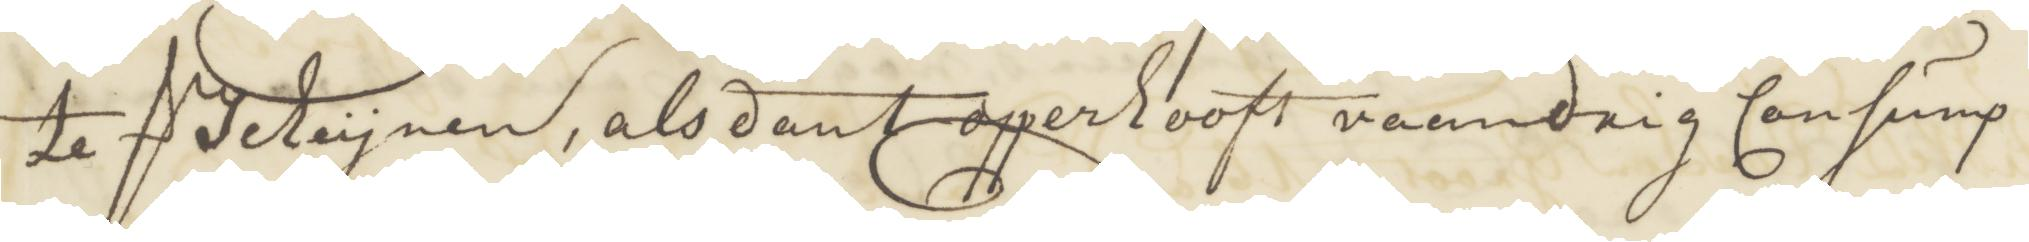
te verscheijnen, als dant opperhooft vaandrig Consump
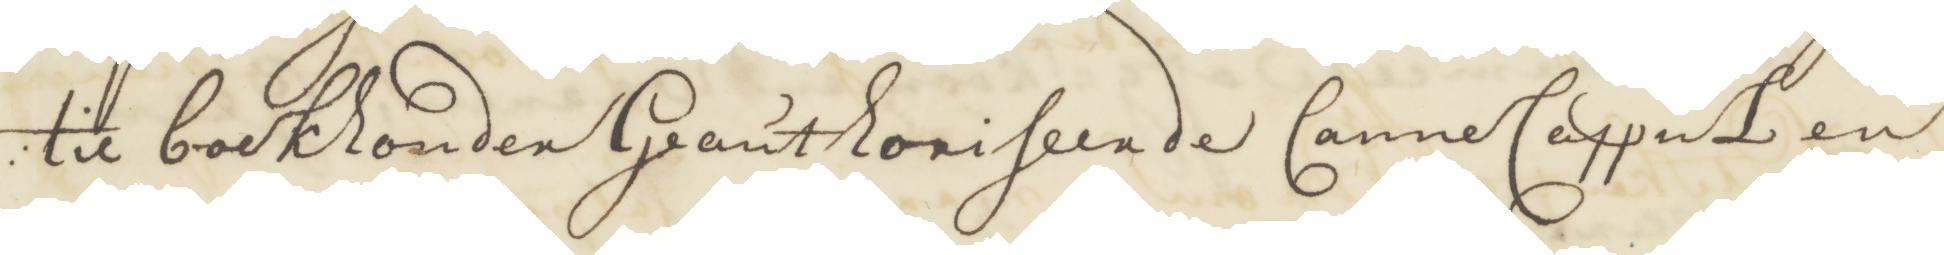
„tie boekhouder Geauthoriseerde Canne Cappul en
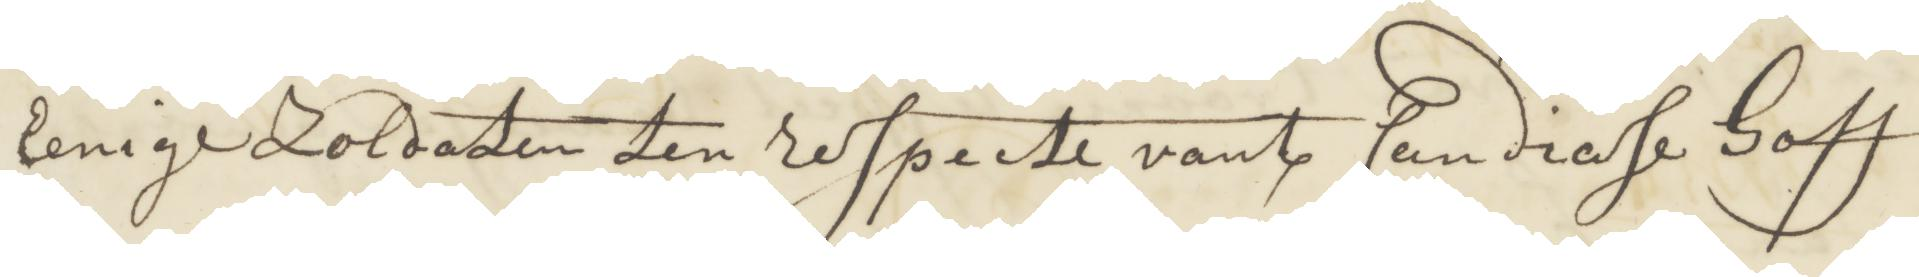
Eenige Zoldaten ten respecte vant Candiase hoff
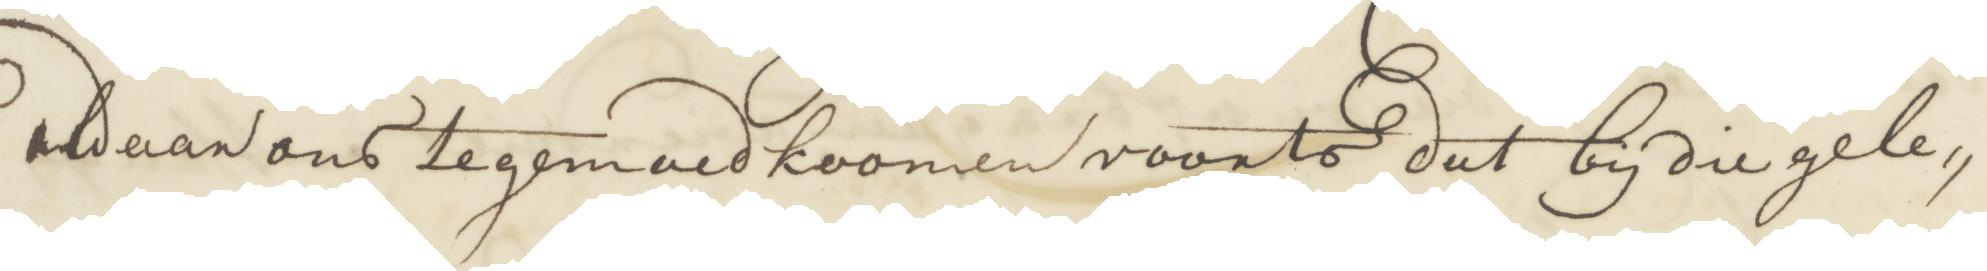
aldaar ons te gemoed koomen voorts dat bij die gele„
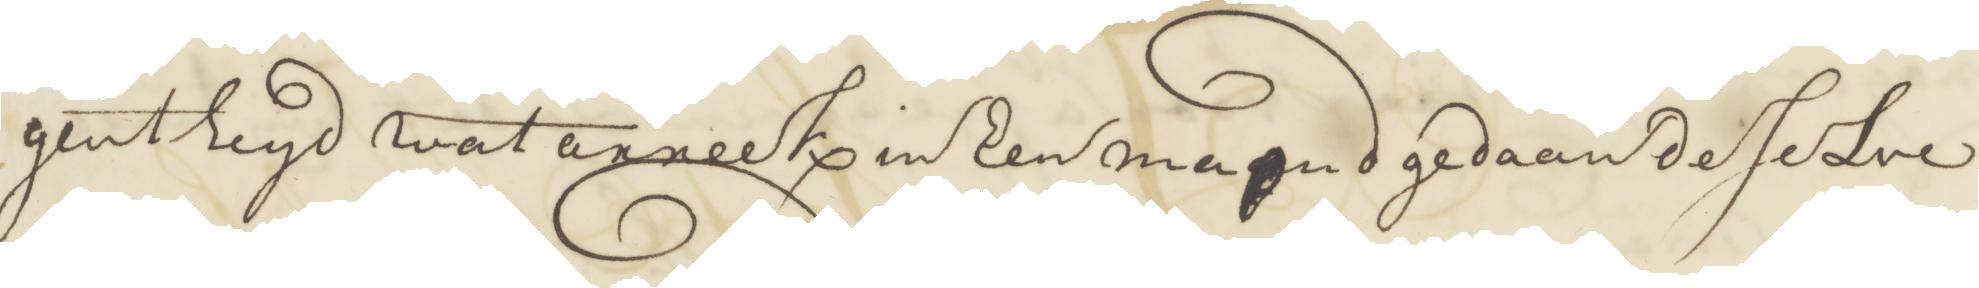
gentheyd wat arreek in Een maand gedaan deselve
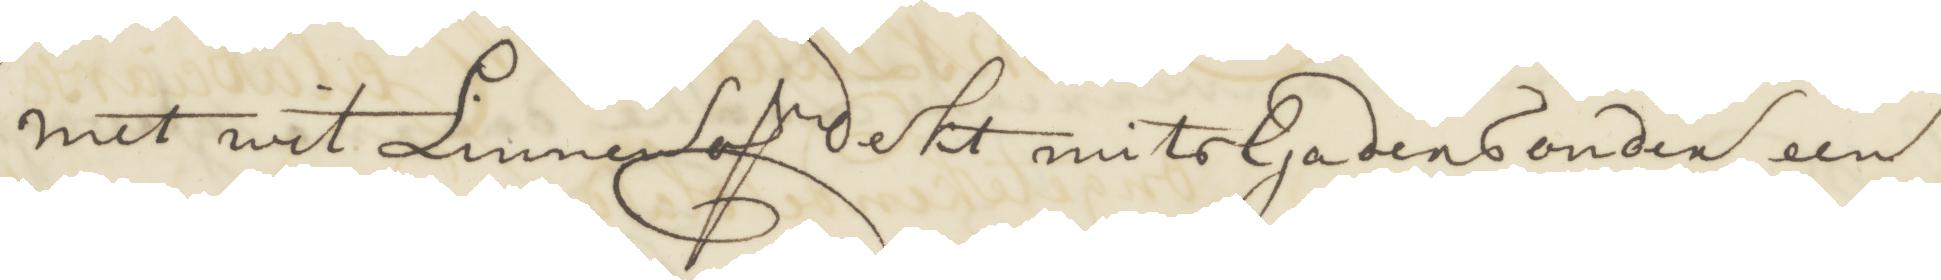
met wit Linnen overdekt mitsgaders onder een
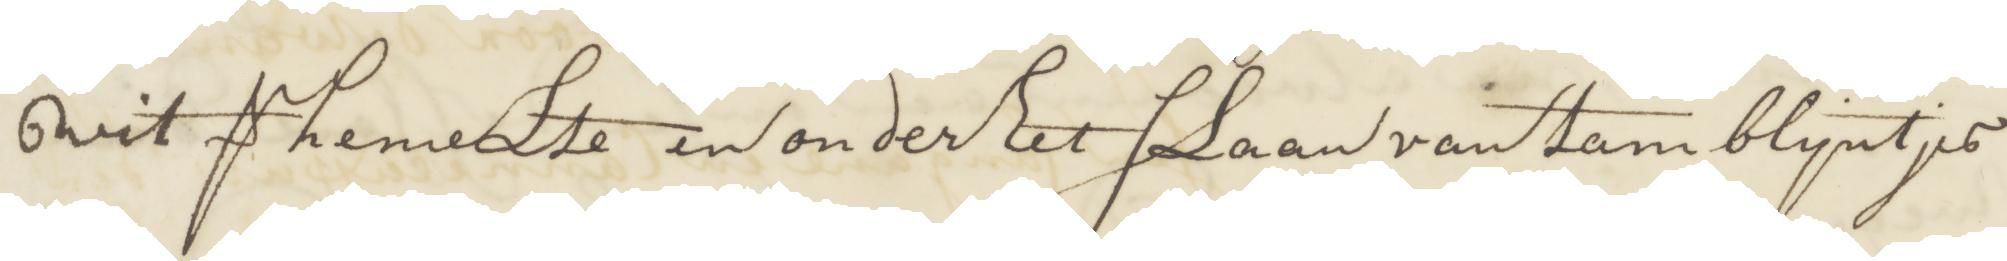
wit verhemelte en onder het Slaan van tamblijntjes
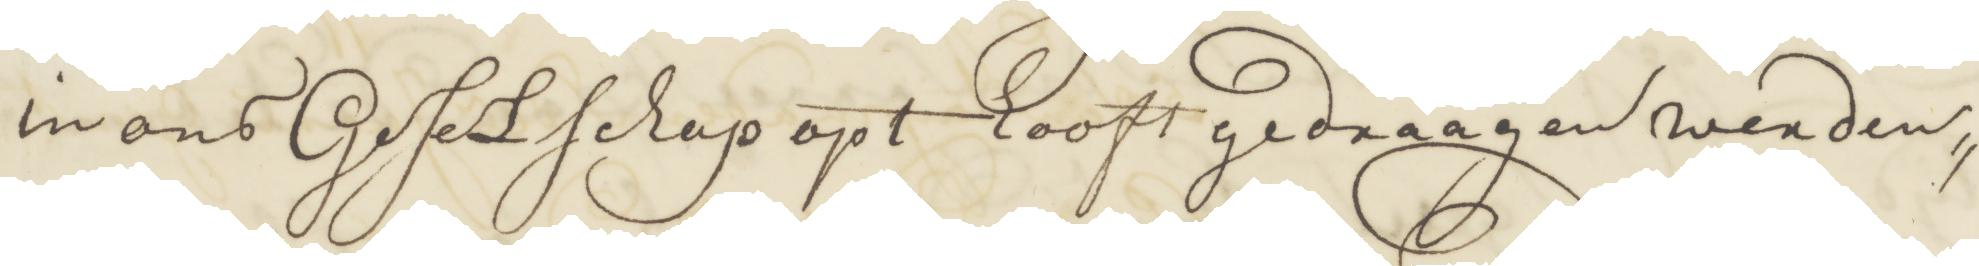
in ons Geselschap opt hooft gedraagen werden„
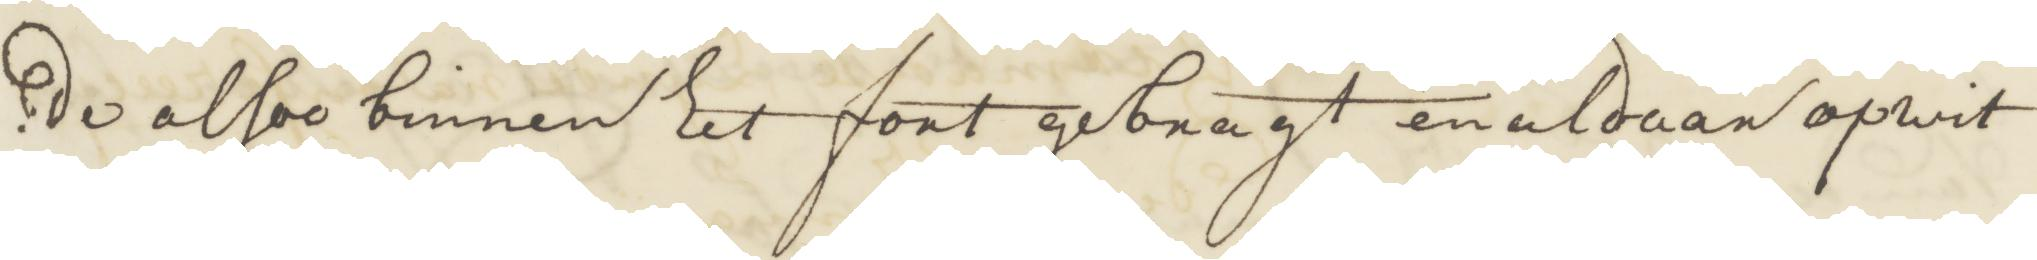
de alsoo binnen het fort gebragt en aldaar op wit
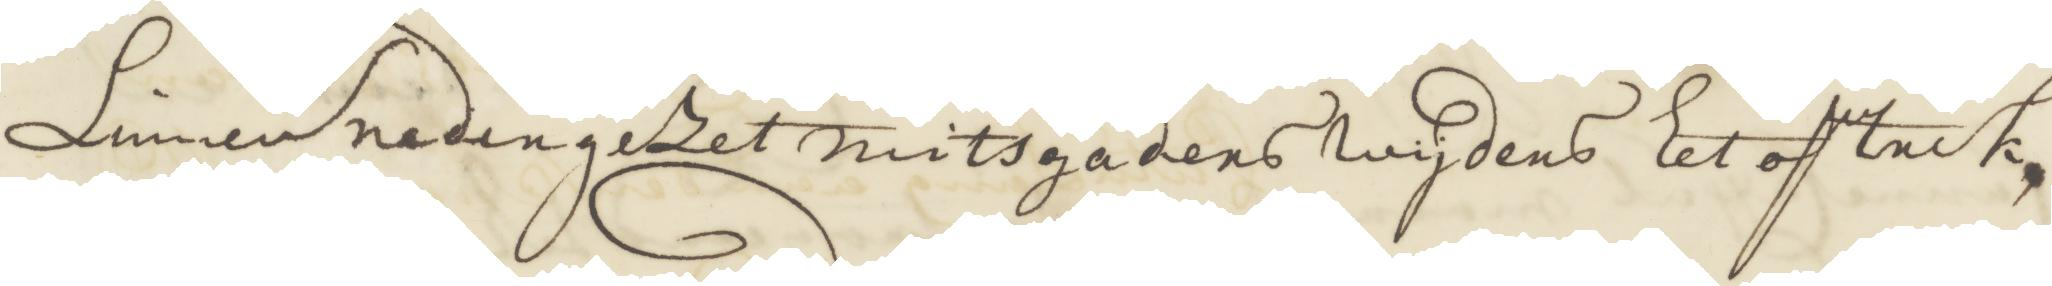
Linnen nedergezet mitsgaders wijders het optrek„
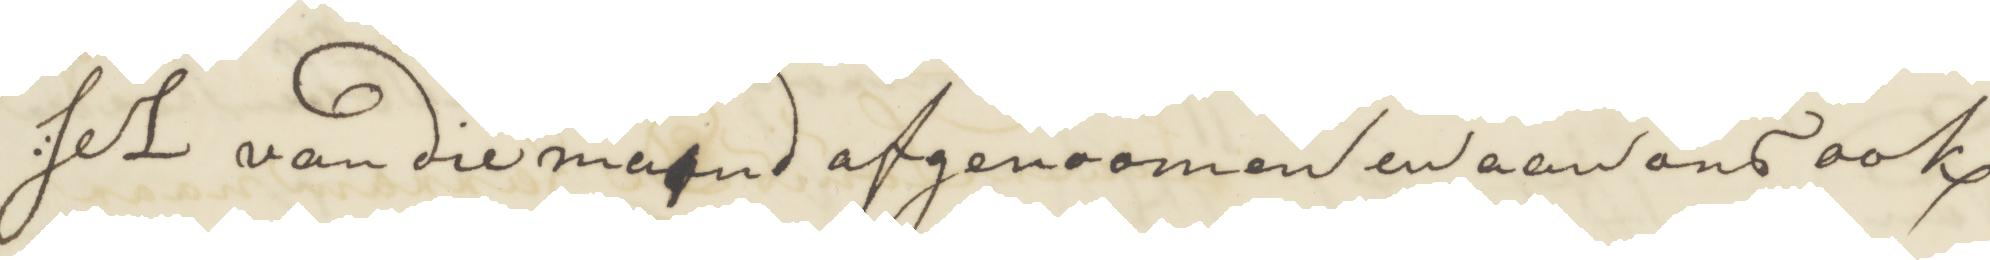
:sel van die maand afgenoomen en aan ons ook
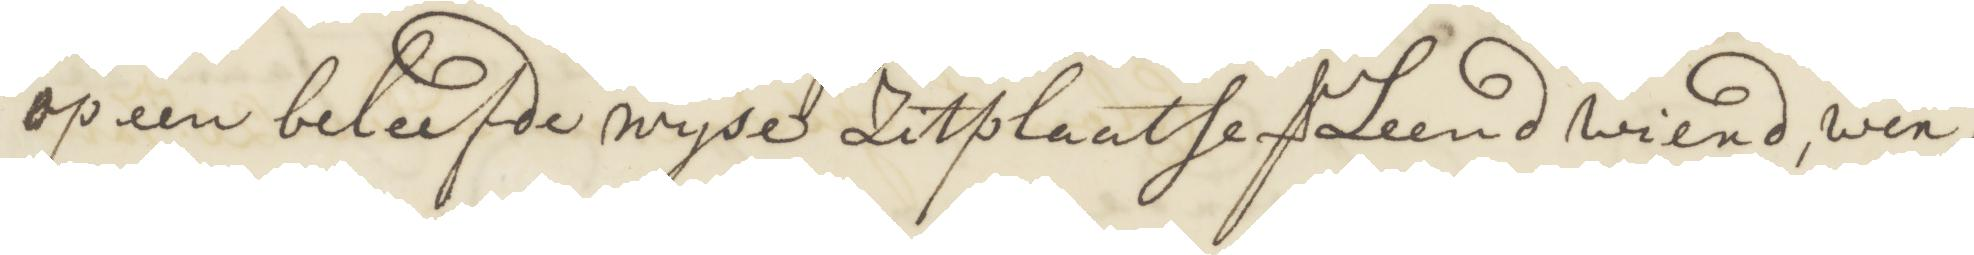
op een beleefde wijse Zitplaatse verleend wierd, wer„
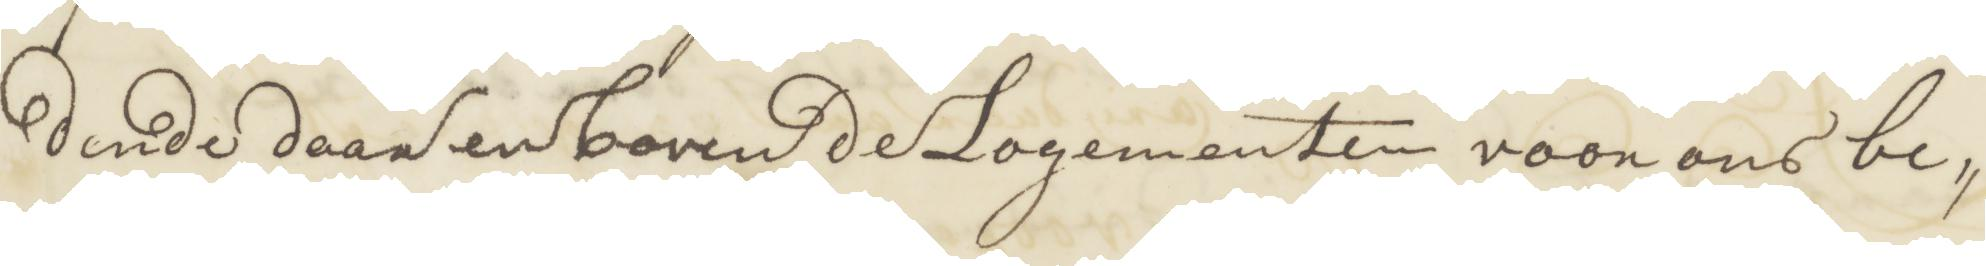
dende daar en boven de Logementen voor ons be„
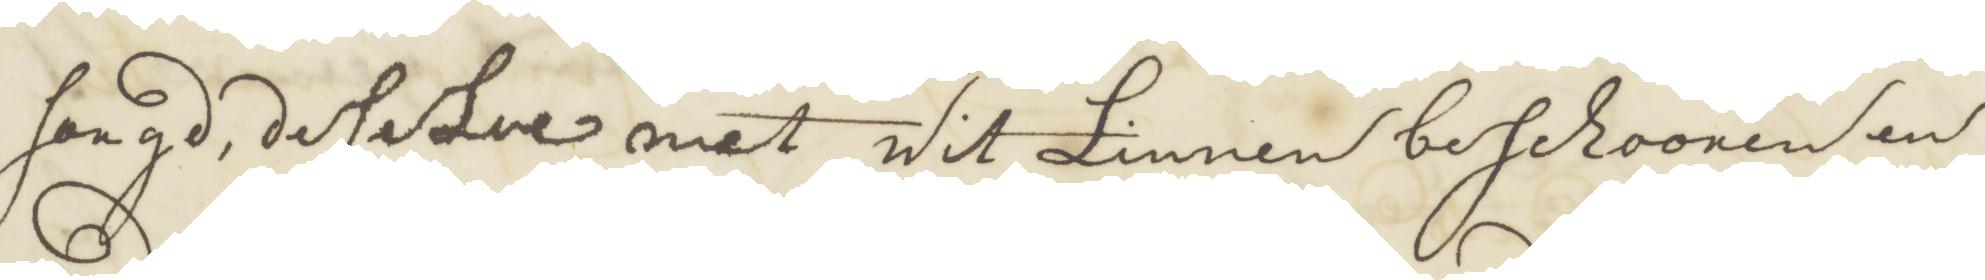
sorgd, deselve met wit Linnen beschooren en
